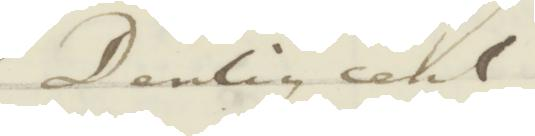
Dertig cent
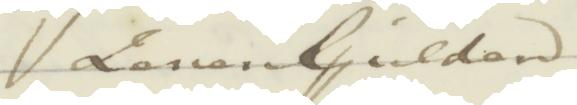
ZevenGulden
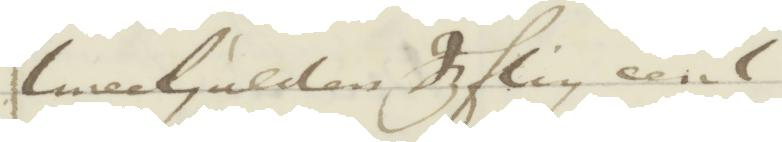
tweeGulden Vyftig cent
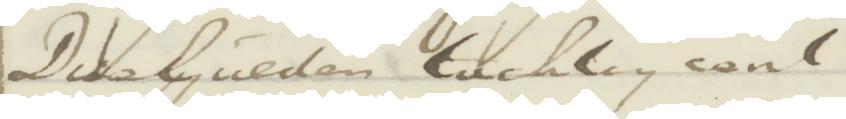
DrieGulden tachtig cent
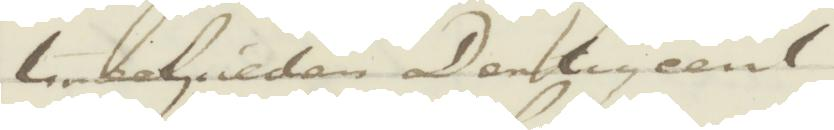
tweeGulden Dertig cent
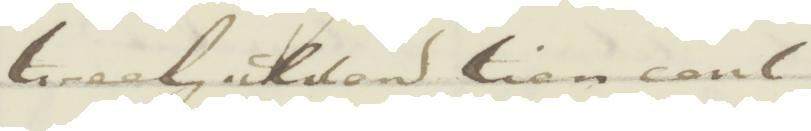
tweeGulden tien cent
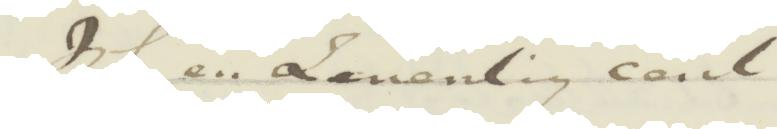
Vyf en Zeventig cent
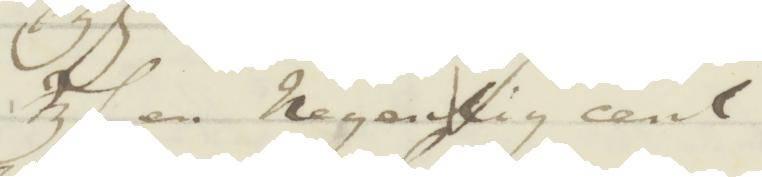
Vyf en negentig cent
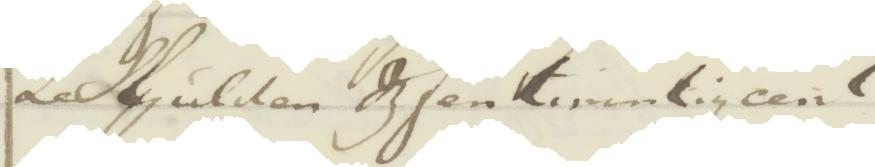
Zes Gulden Vyf en twintig cent
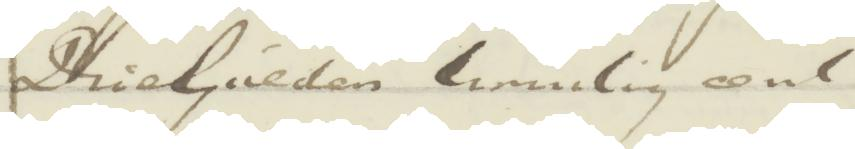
DrieGulden twintig cent
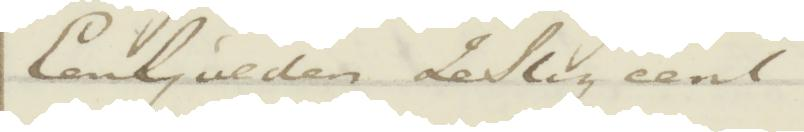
EenGulden zestig cent
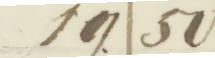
ƒ 19 50
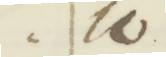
„ 10
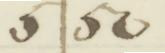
5 50
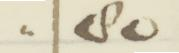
„ 80
